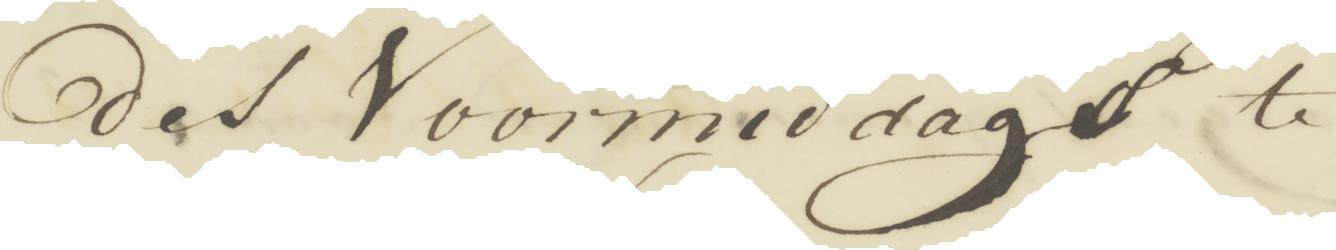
des Voormiddags te
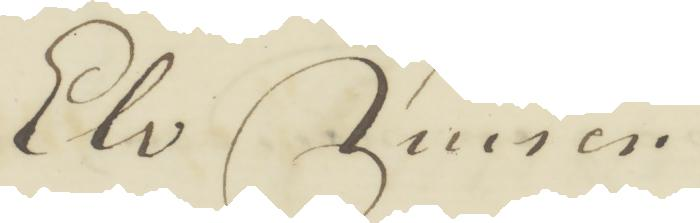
Elv Uuren
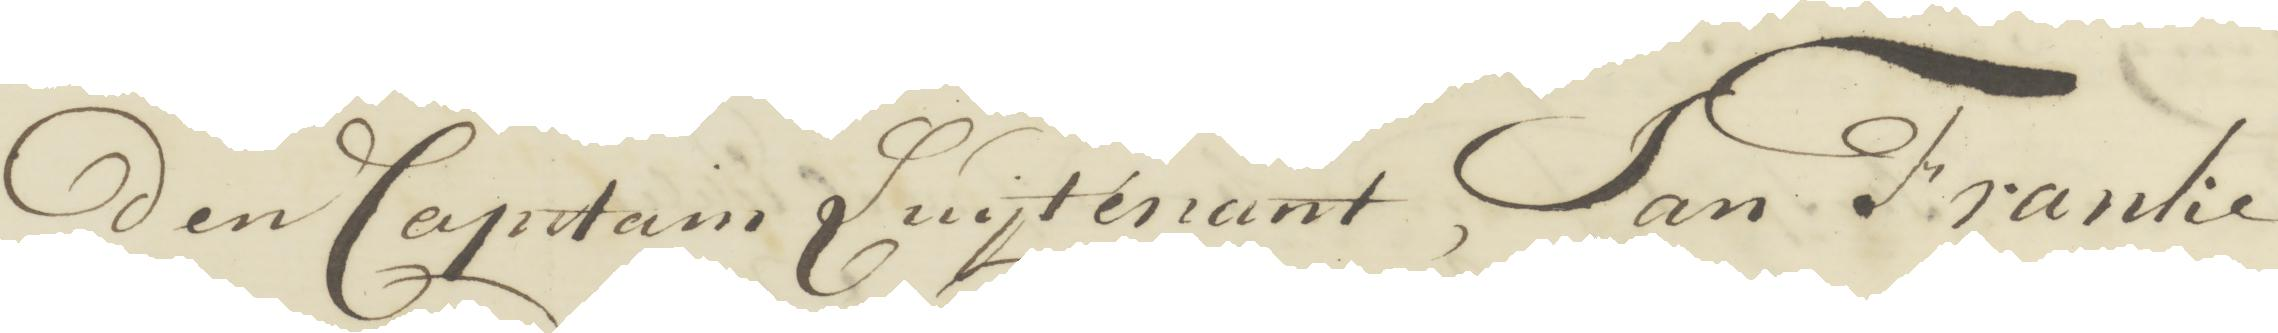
den Capitain Luijtenant, Ian Franke
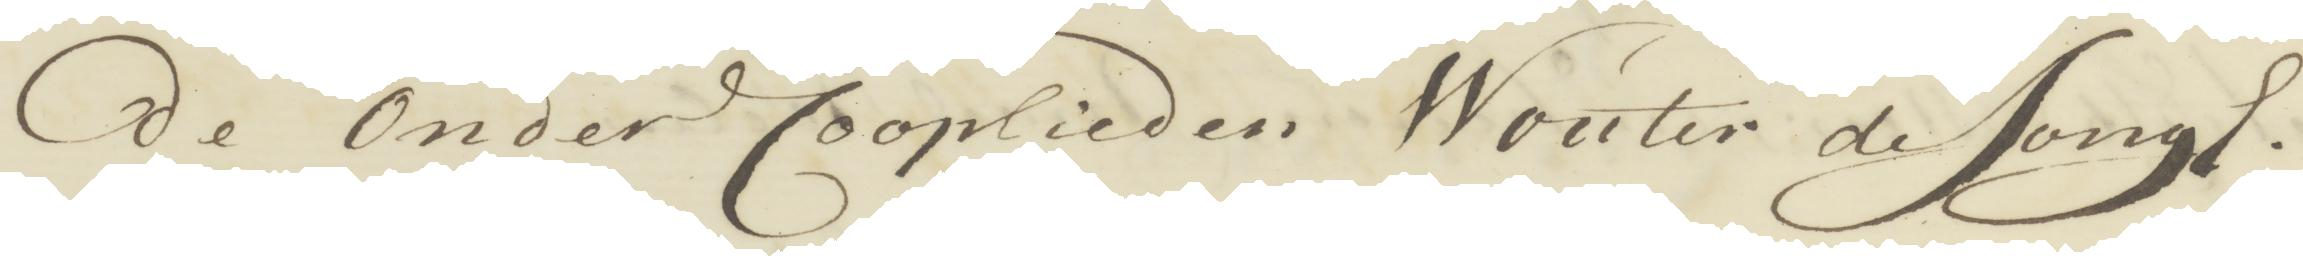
de onder Cooplieden Wouter de Jongh.
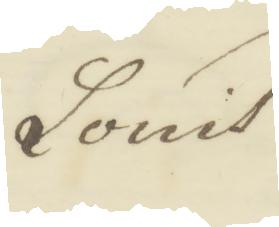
Louis
